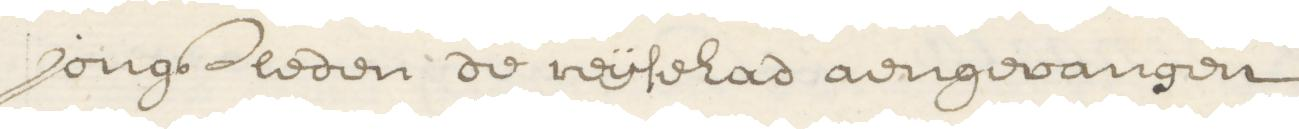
jongstleden de reijsehad aengevangen
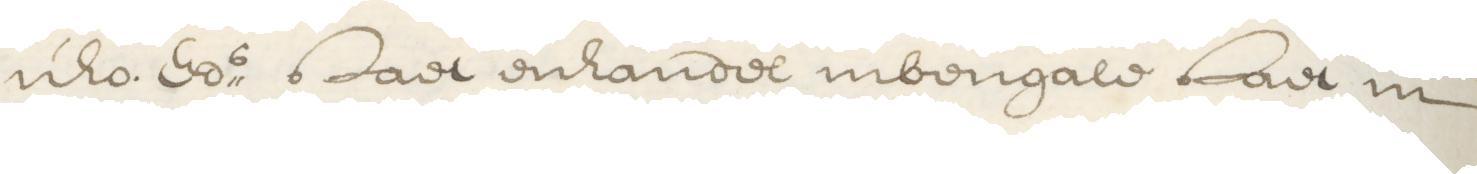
uho. Ed=e staet enhandel in bengale staet in
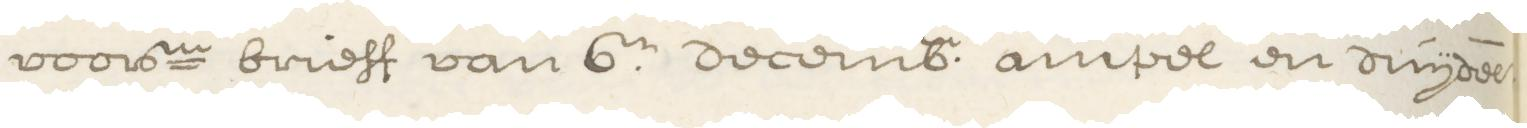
voor=m brieff van 6.n decemb. ampel en duijdel
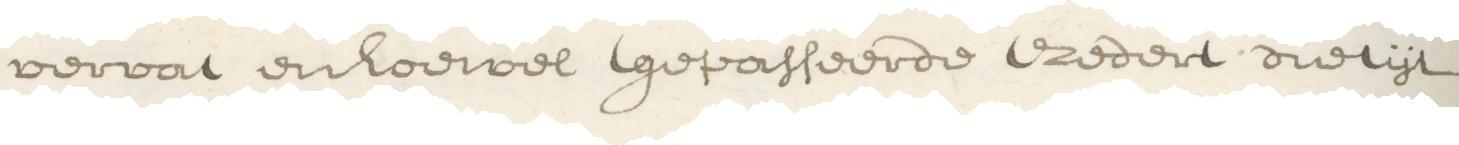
vervat enhoewel tgepasseerde zedert die tijt
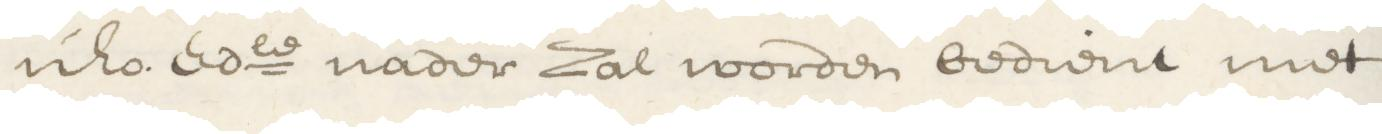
uho. Ed=le nader zal worden bedient met
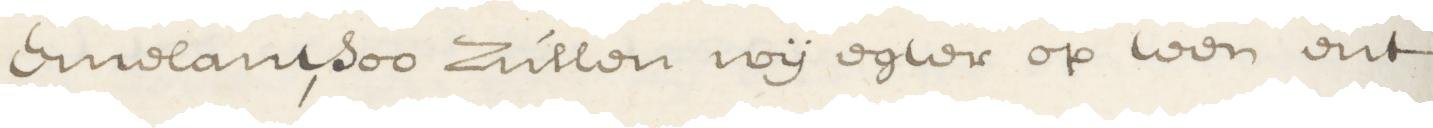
Emelant, soo zullen wij egter op teen ent
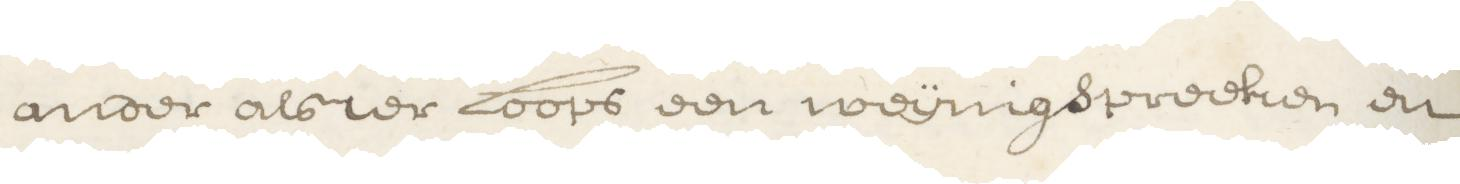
ander alster loops een weijnig spreeken en
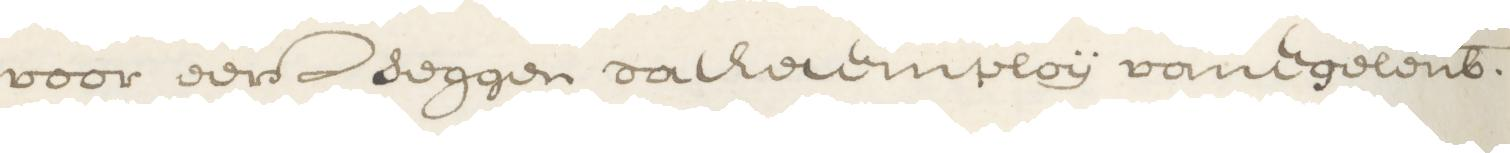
voor eerst seggen dathet emploij van Egelenb.
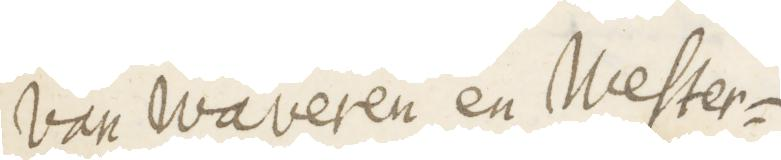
van Waveren en Wester=
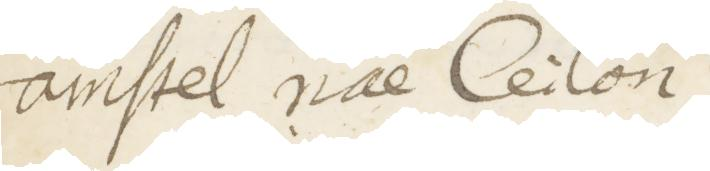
amstel nae Ceilon
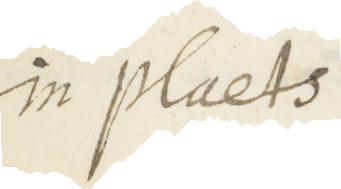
in plaets
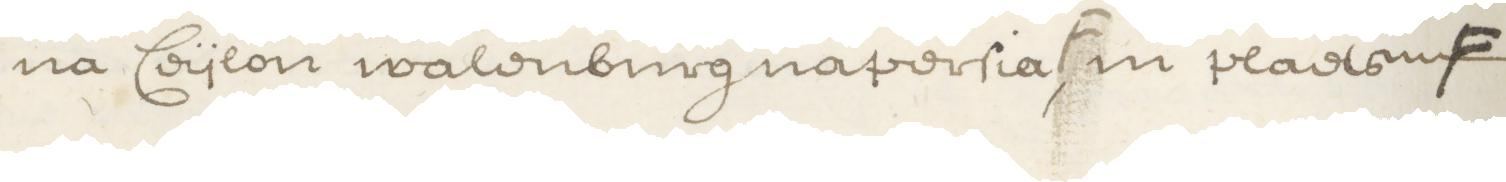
na Ceijlon walenburg na persia,F in plaetse F
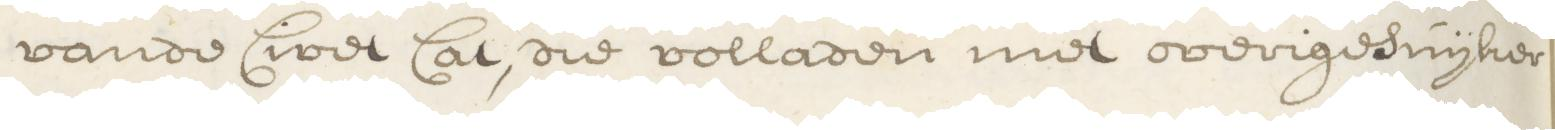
vande Civet Cat, die volladen met overige suijker
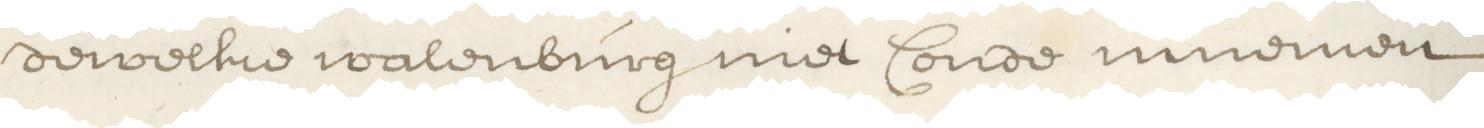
dewelke walenburg niet Conde innemen
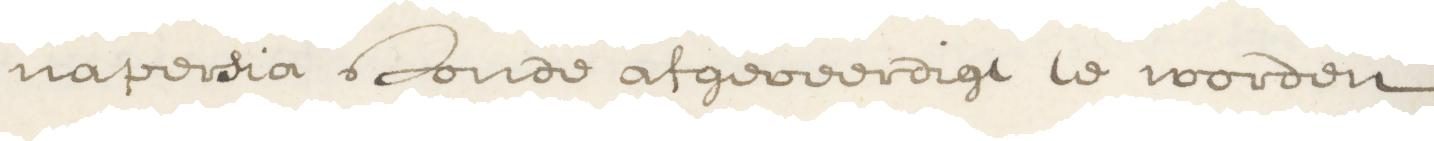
na persia stonde afgeveerdigt te worden,
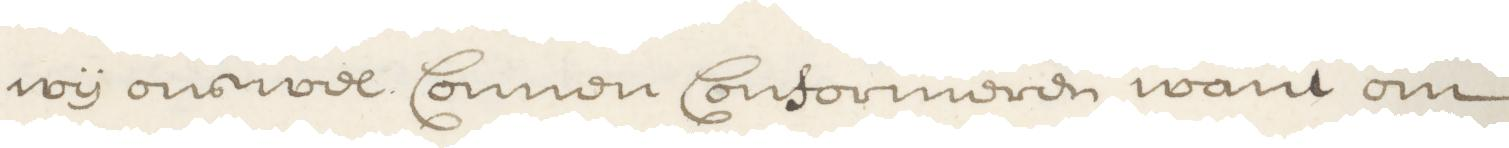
wij onswel connen conformeren, want om
